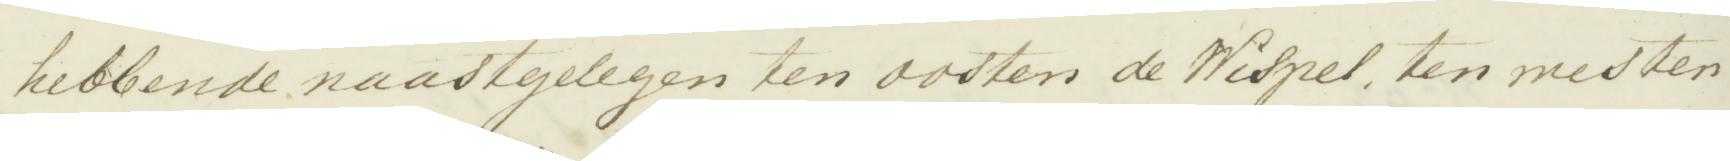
hebbende naastgelegen ten oosten de Wispel, ten westen
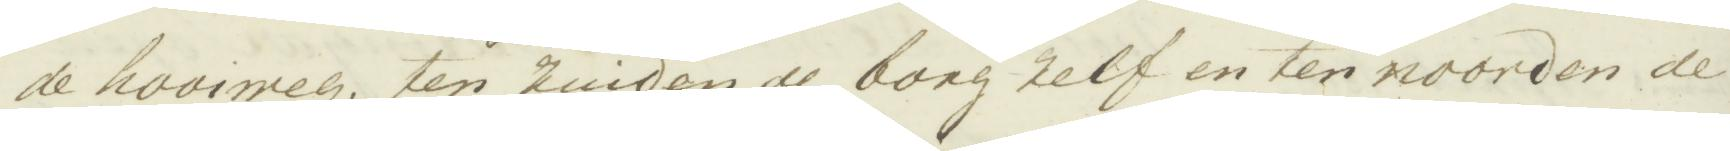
de hooiweg, ten zuiden de borg zelf en ten noorden de
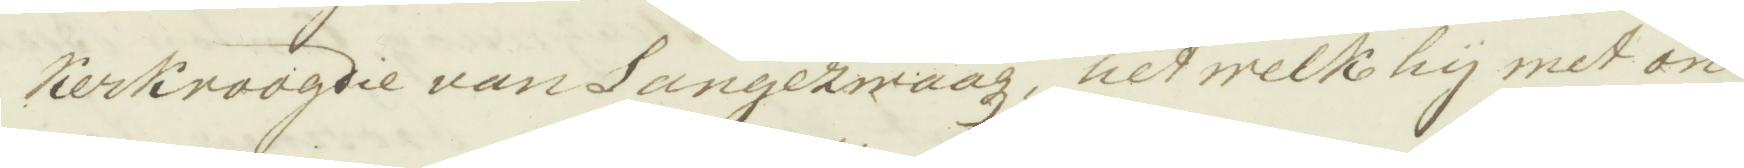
Kerkvoogdie van Langezwaag, het welk hij met on
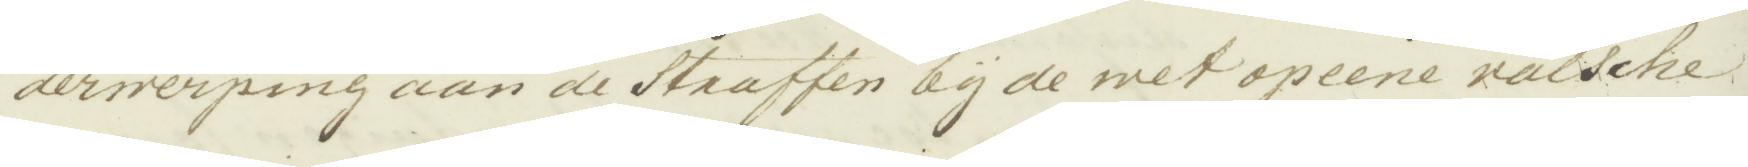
der werping aan de straffen bij de wet op eene valsche
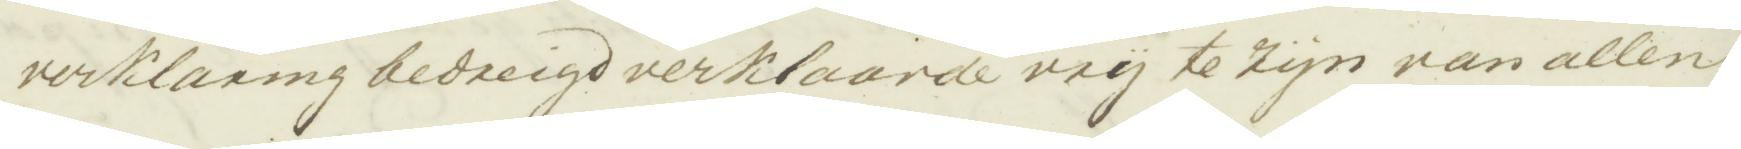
verklaring bedreigd verklaarde vrij te zijn van allen
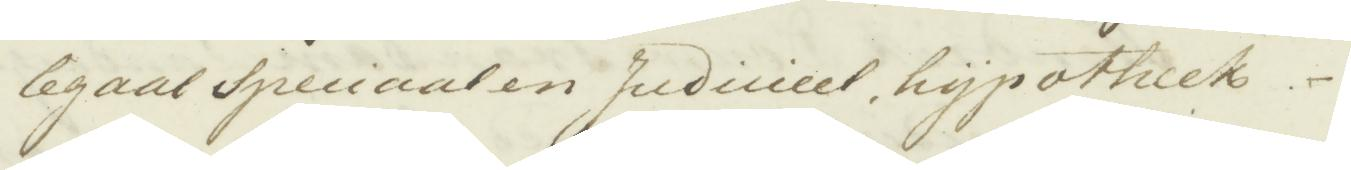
legaal speciaal en Judicieel, hijpotheek.-
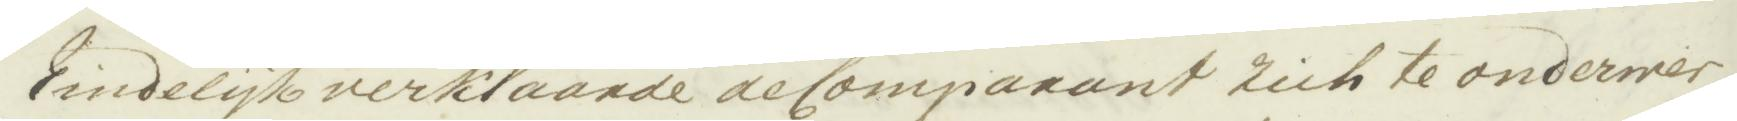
Eindelijk verklaarde de Comparant zich te onderwer
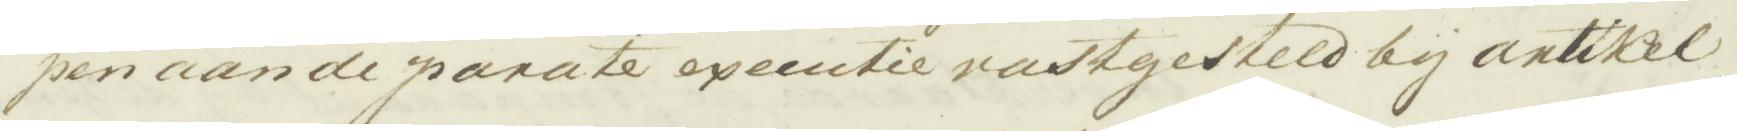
pen aan de parate executie vastgesteld bij artikel
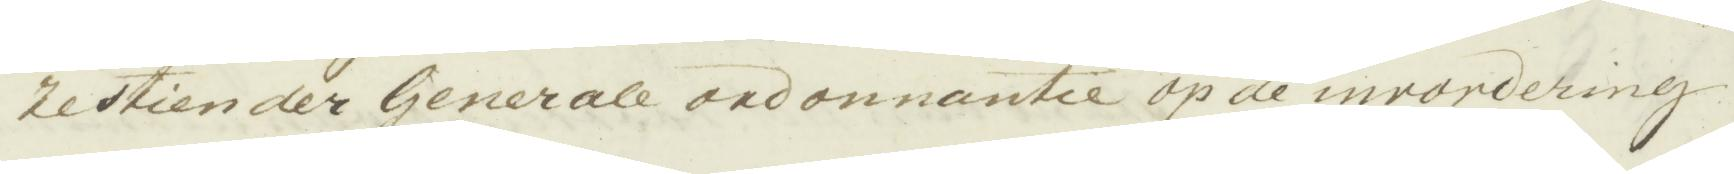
zestien der Generale ordonnantie op de invordering
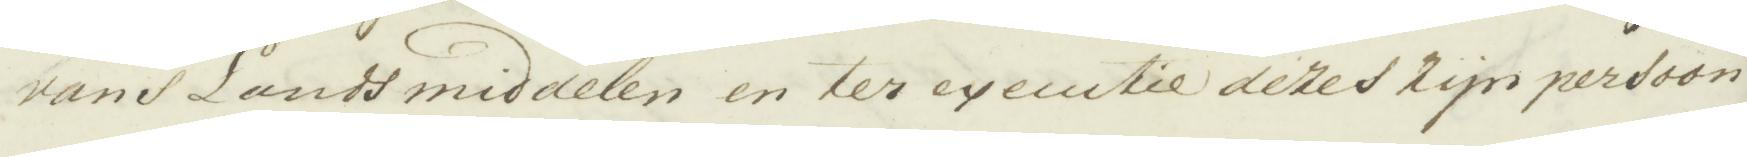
van 's Landsmiddelen en ter executie dezes zijn persoon
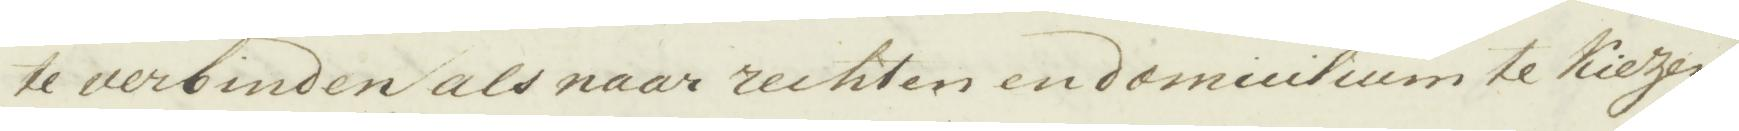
te verbinden als naar rechten en domicilium te kiezen
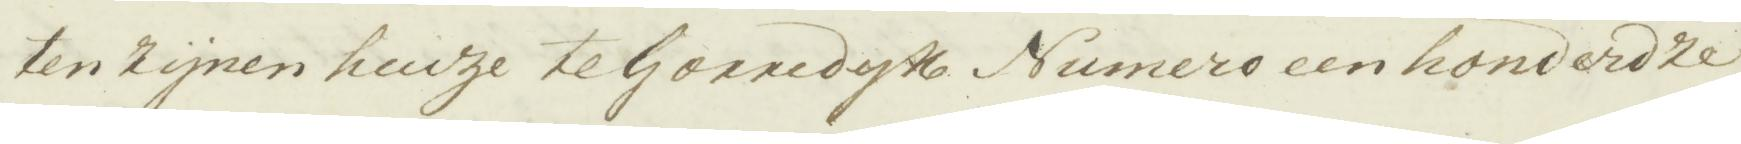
ten zijnen huize te Gorredyk Numero een honderd ze
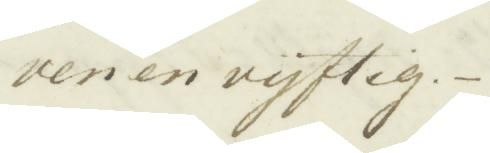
ven en vijftig.-
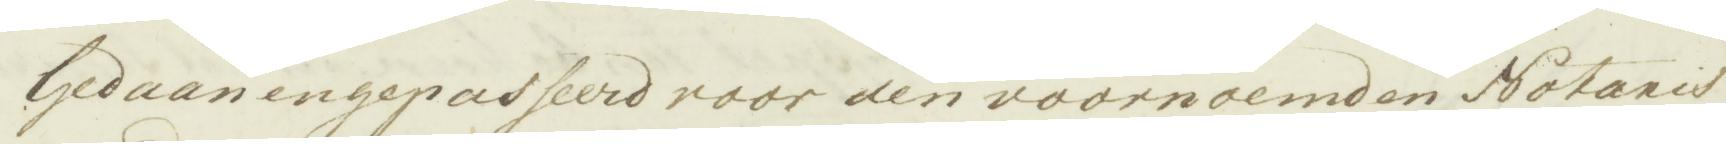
Gedaan en gepasseerd voor den voornoemden Notaris
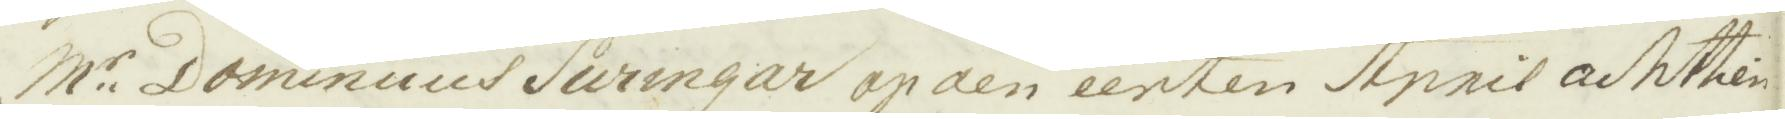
M:r Dominicus Suringar op den eersten April achttien
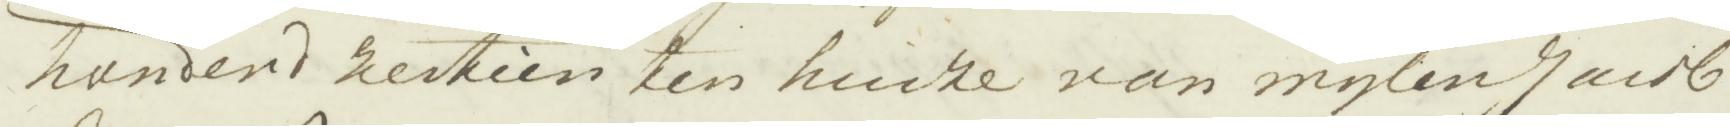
honderd zestien ten huize van wylen Jacob
